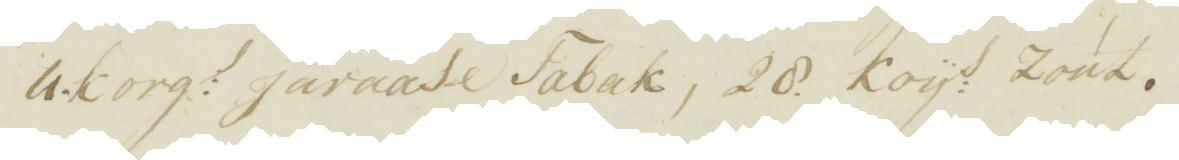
4 korg:s javaase Tabak, 28. Koij:s zout.
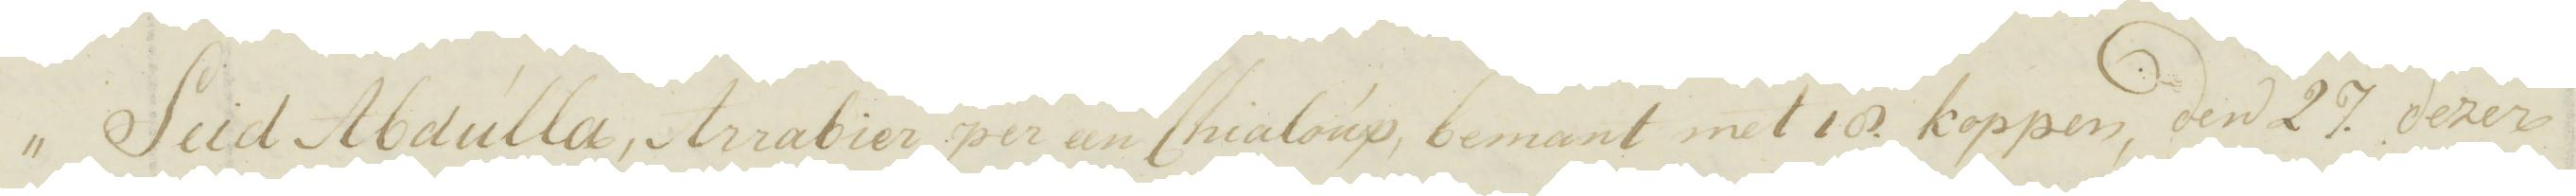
„ Seid Abdulla, Arrabier per een Chialoup, bemant met 18. koppen, den 27. dezer
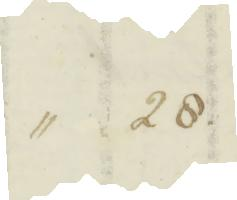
„ 28.
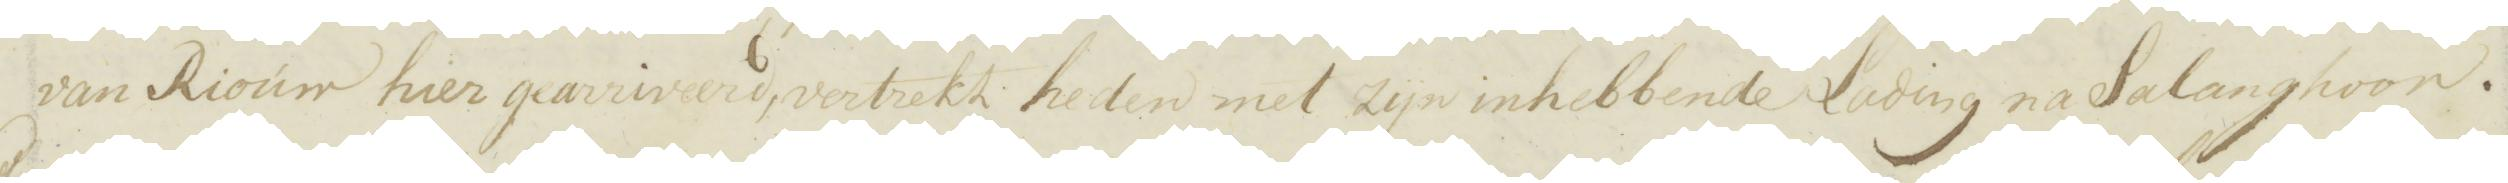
van Riouw hier gearriveerd, vertrekt heden met zijn inhebbende Lading na Salanghoor.
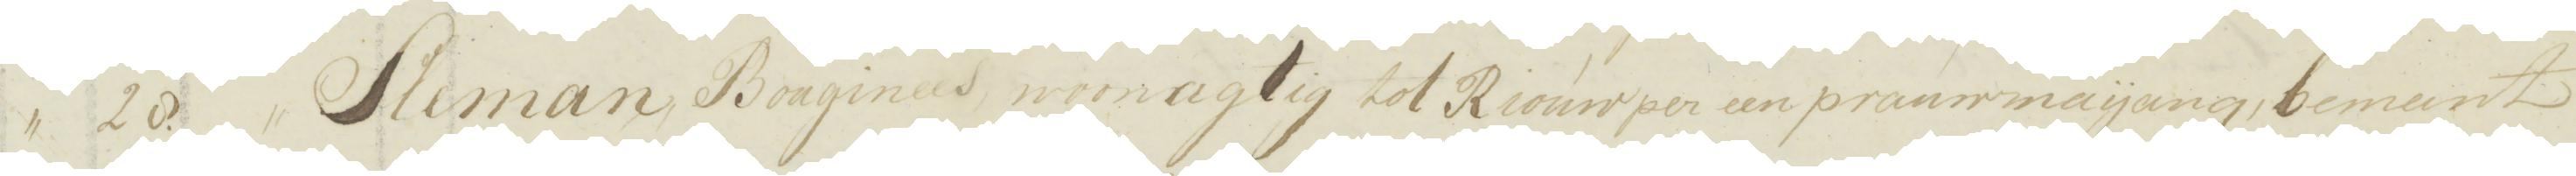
„ 28 „ Sliman, Bouginees, woonagtig tot Riouw per een prauw maijang, bemant
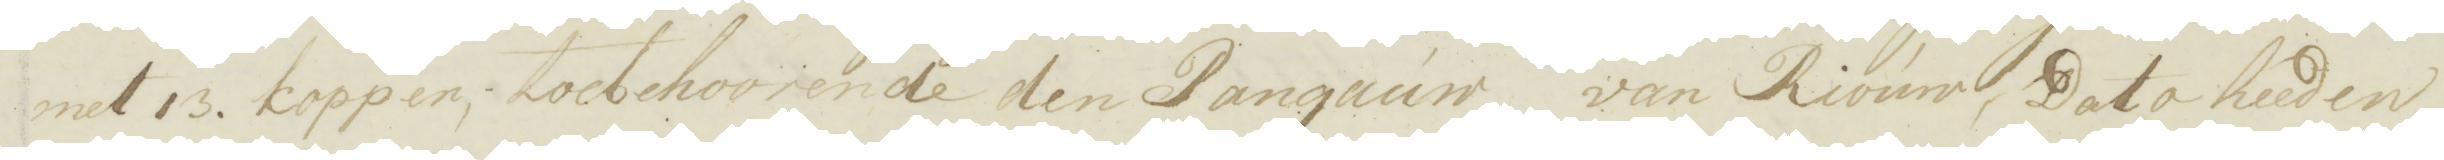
met 13. koppen, toebehoorende den Pangauw van Riouw, Dato heeden
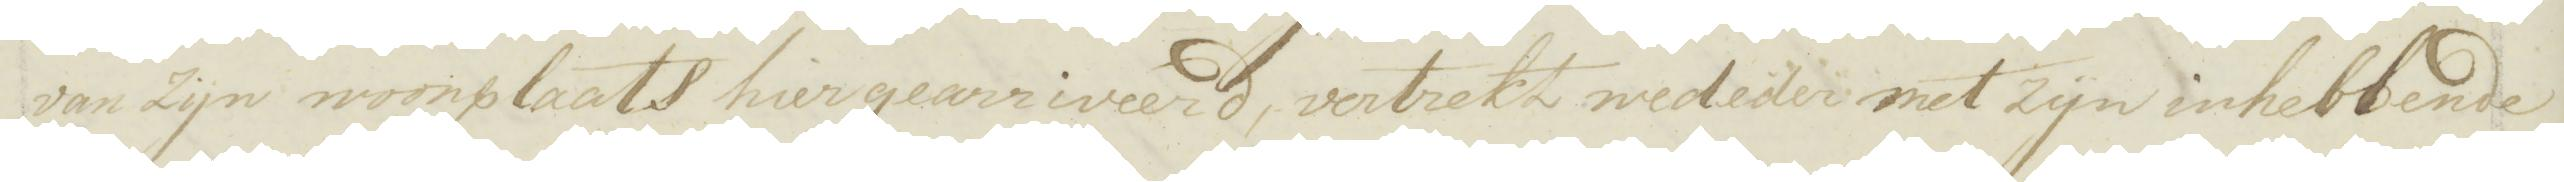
van zijn woonplaats hier gearriveerd, vertrekt wededer met zijn inhebbende
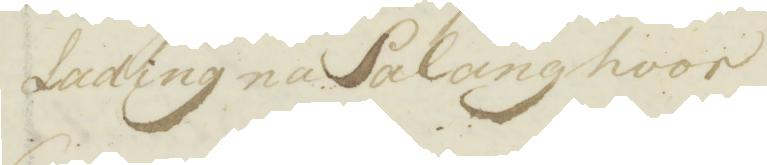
Lading na Salanghoor
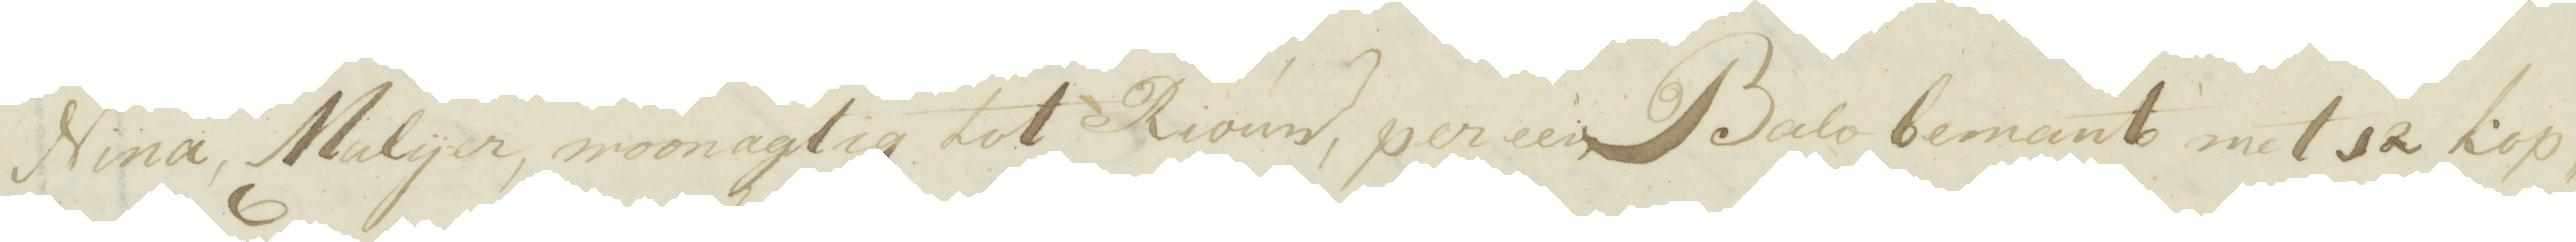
Nina, Malijer, woonagtig tot Riouw, per een Balo bemant met 12. kop
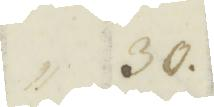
„ 30.
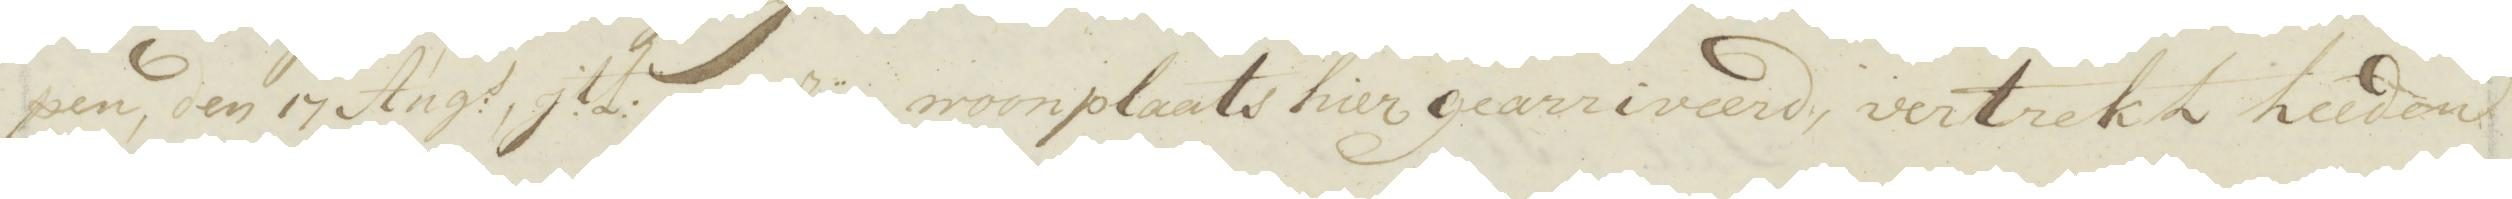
pen, den 17 Aug:s, j:tl woonplaats hier gearriveerd, vertrekt heeden
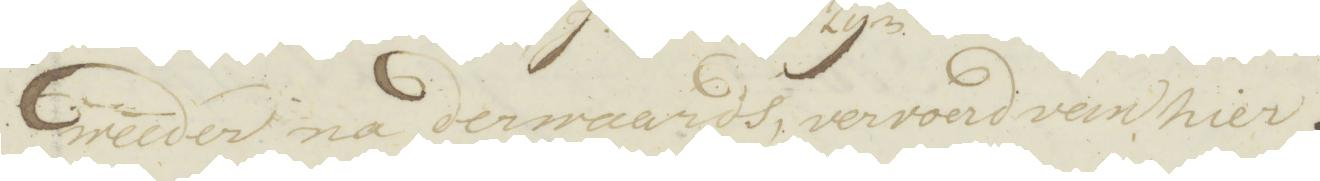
weder na derwaards vervoerd van hier.
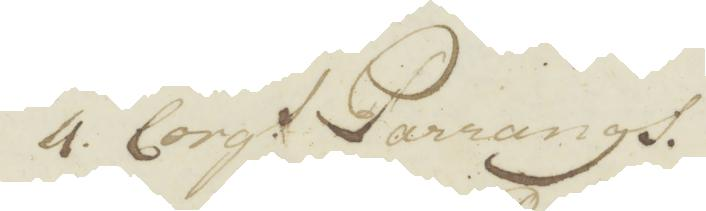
4. Corg.s Parrangs.
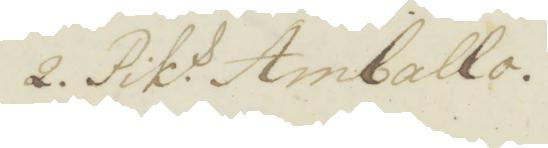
2. Pik.s Amballo.
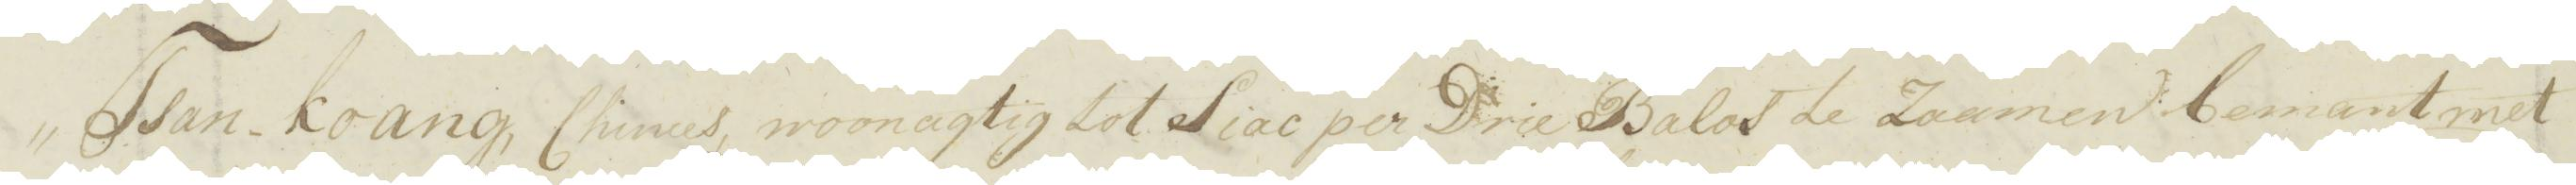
„ Tsan koang Chinees, woonagtig tot Siac per Drie Balos te zaamen bemant met
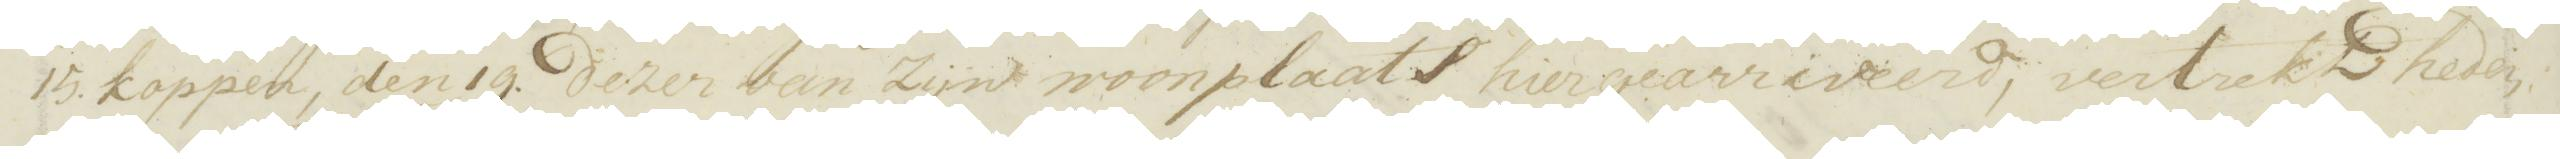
15. koppen, den 14. dezer van zijn woonplaats hier gearriveerd; vertrekt heden:
